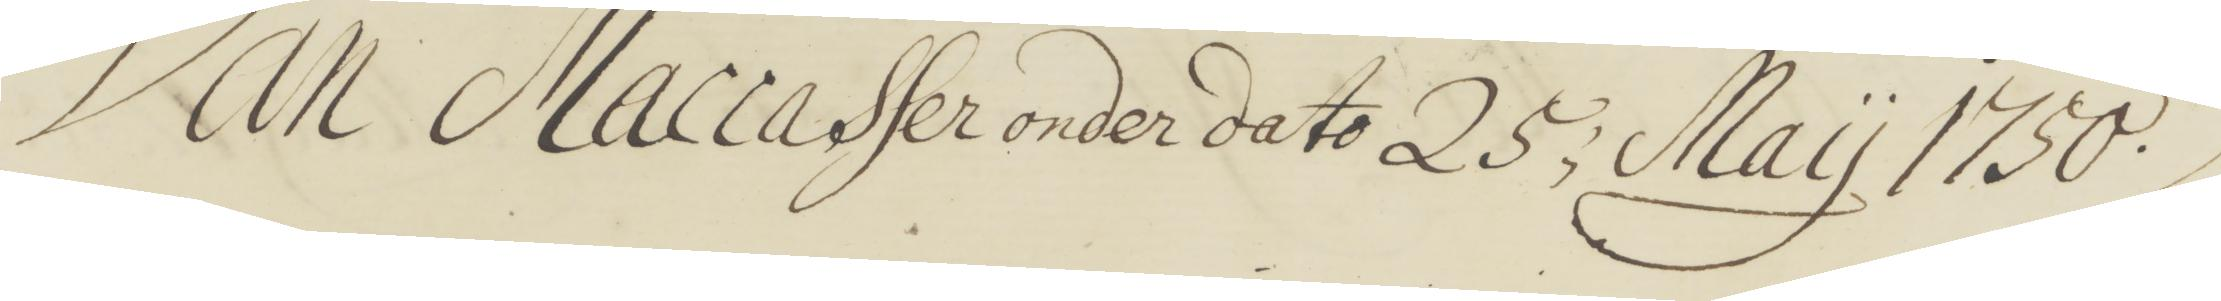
Van Maccasser onder dato 25,' Maij 1750.
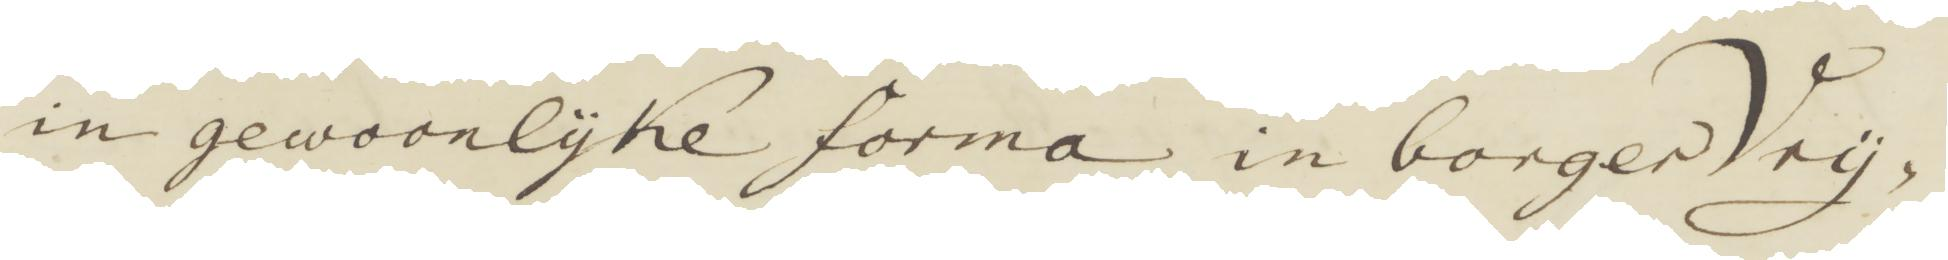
in gewoonlijke forma in borger Vrij„
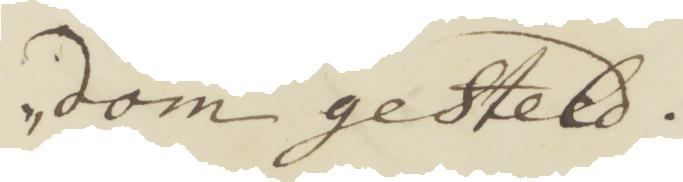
„dom gesteld.
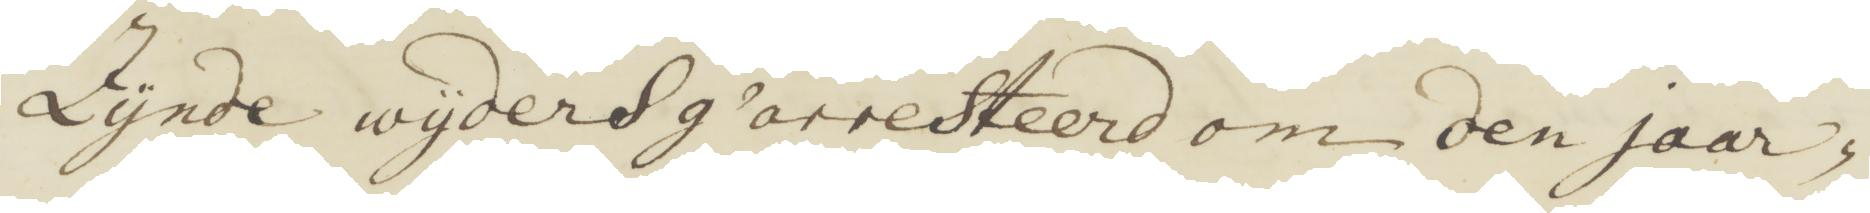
Zijnde wijders g’arresteerd om den jaar„
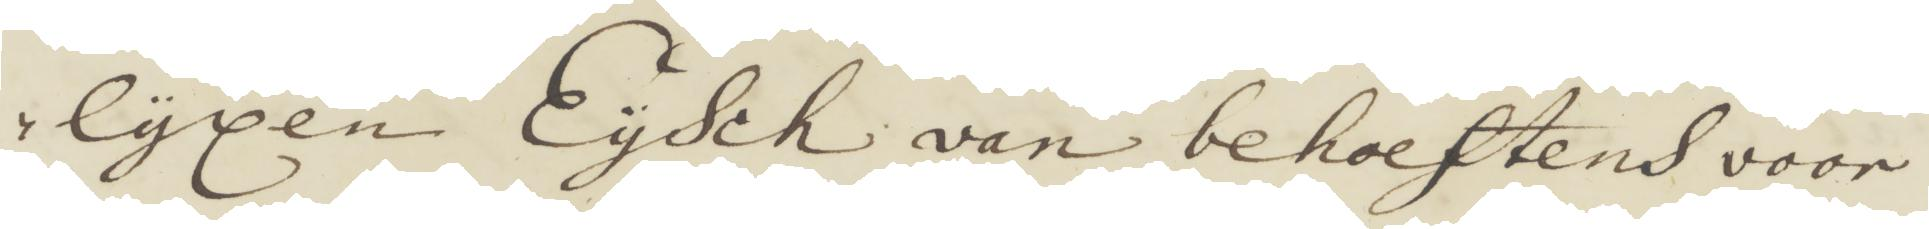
„lijxen Eijsch van behoeftens voor
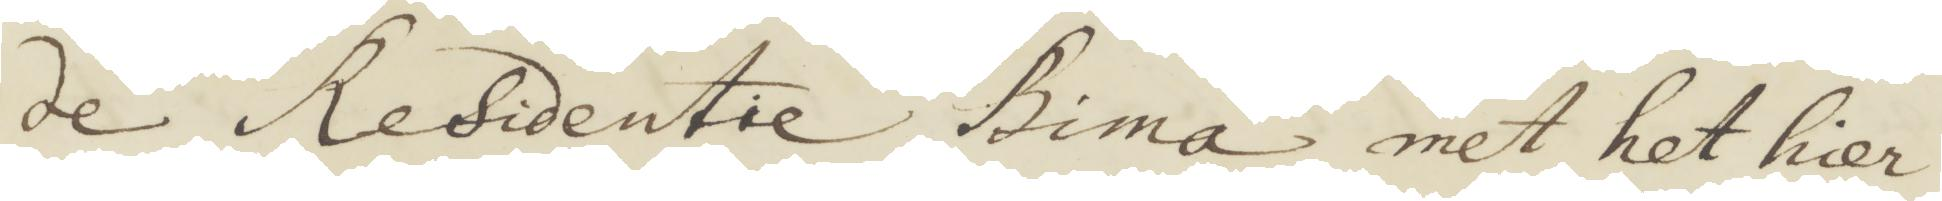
de Residentie Bima met het hier
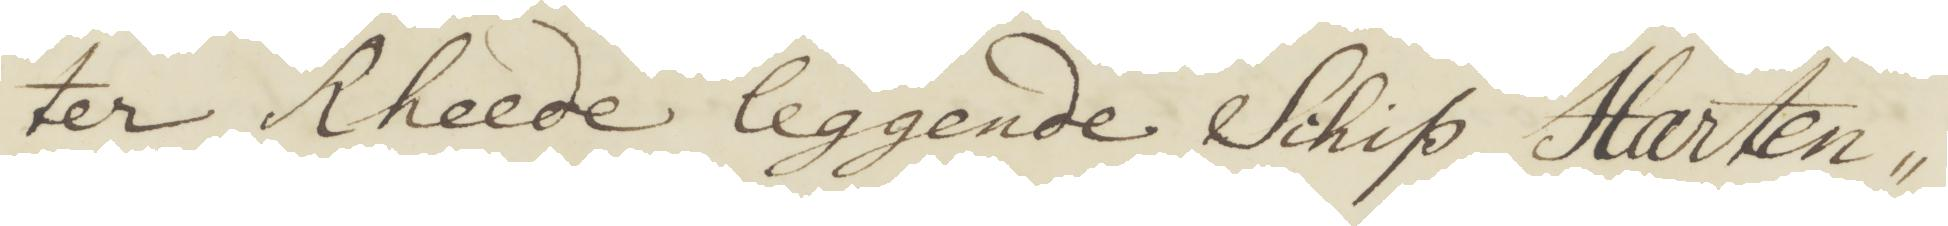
ter Rheede leggende schip Harten„
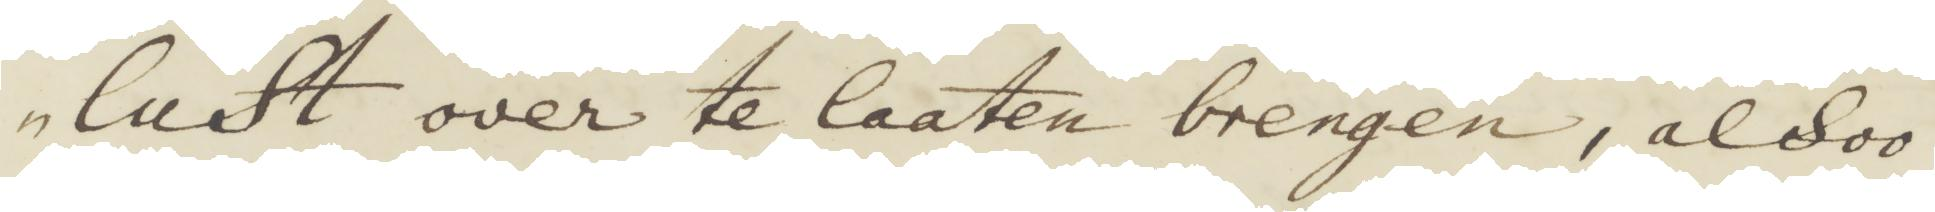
„lust over te laaten brengen, alsoo
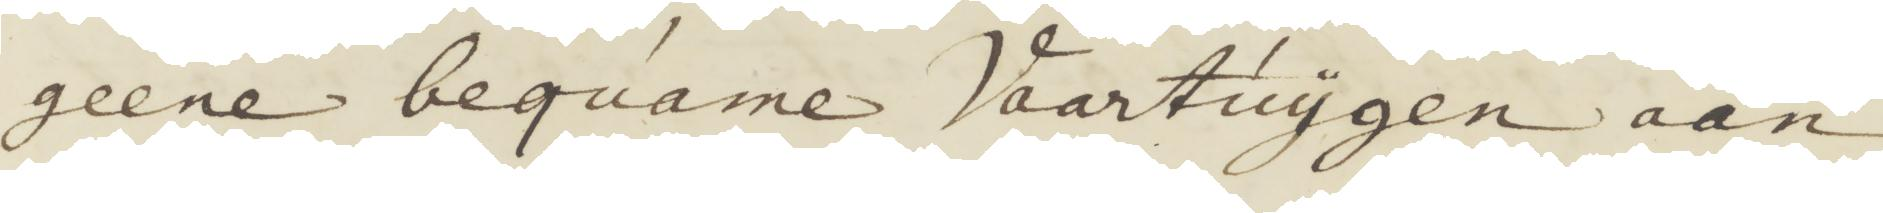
geene bequame Vaartuijgen aan
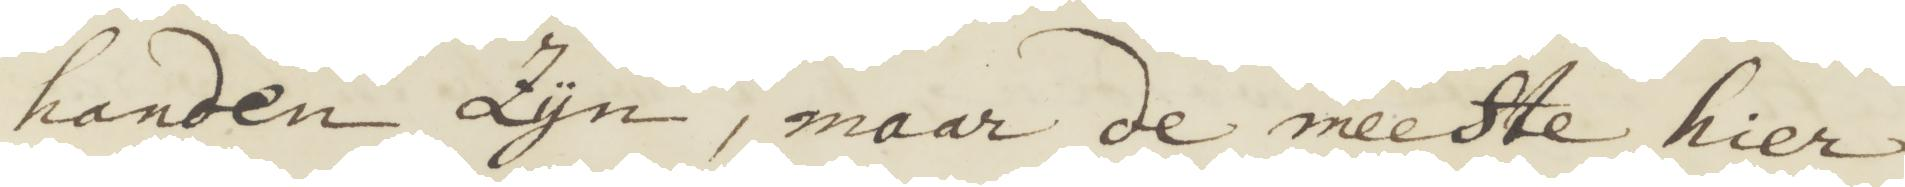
handen zijn, maar de meeste hier
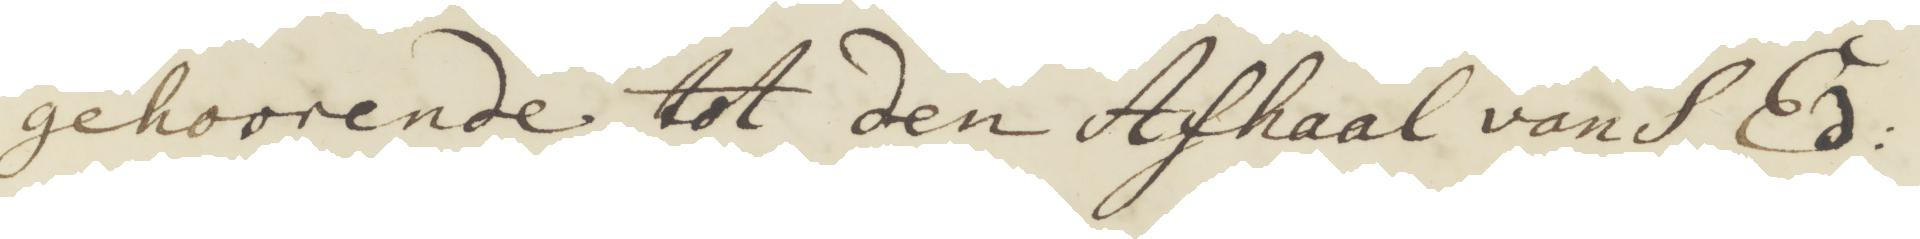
gehoorende tot den Afhaal van 's Ed:
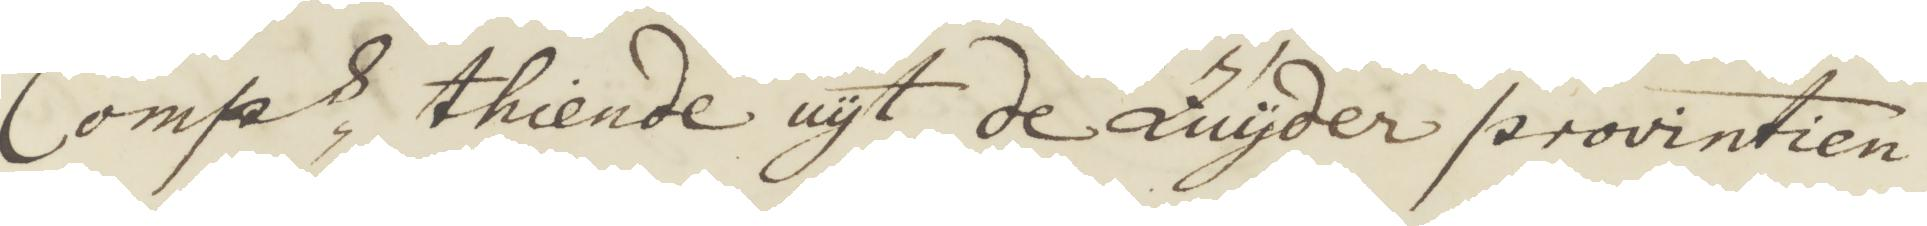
Comp„s thiende uijt de Zuijder provintien
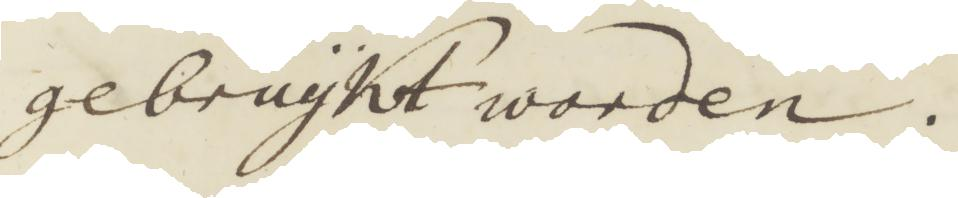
gebruijkt worden.
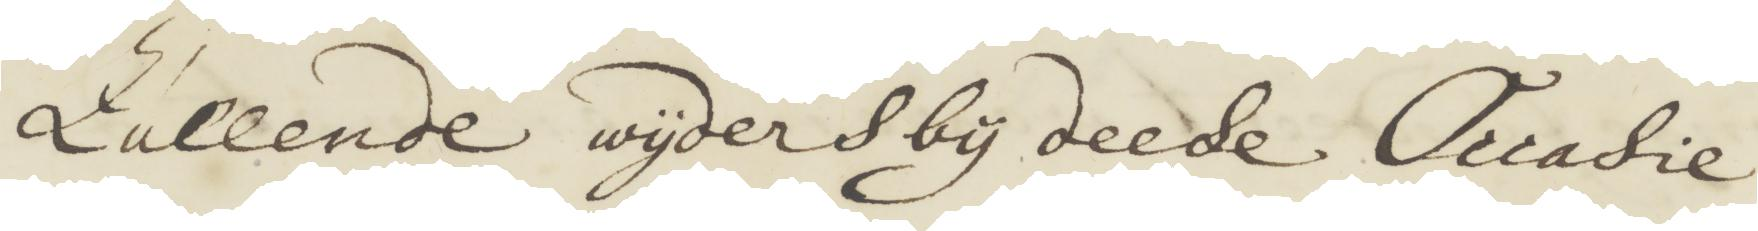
Zullende wijders bij deese Occasie
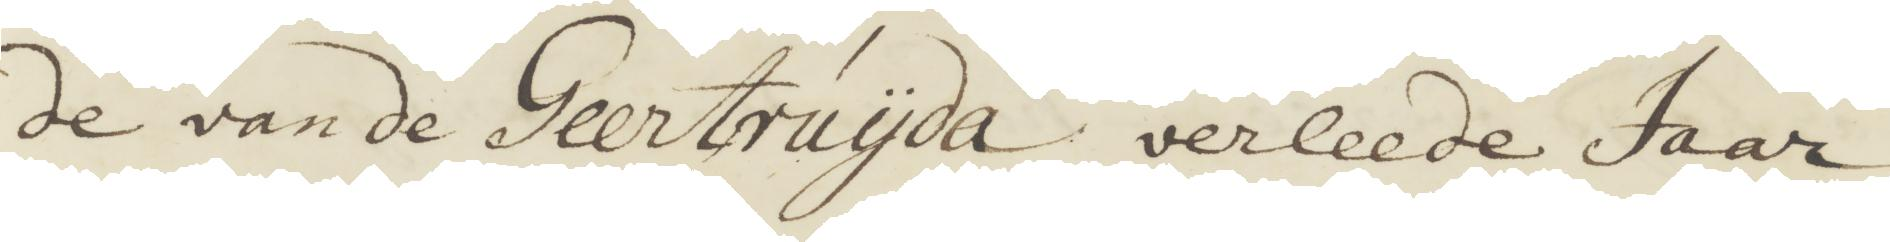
de van de Geertruijda verleede Iaar
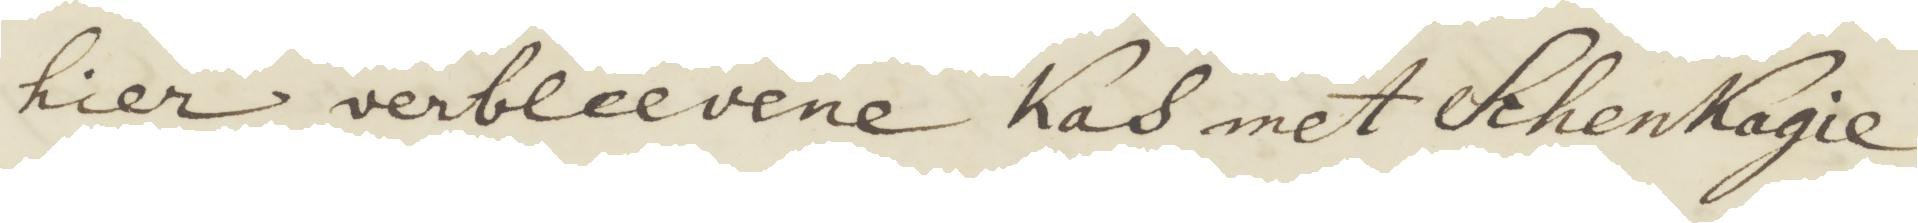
hier verbleevene kas met schenkagie
